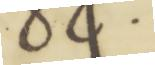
84.
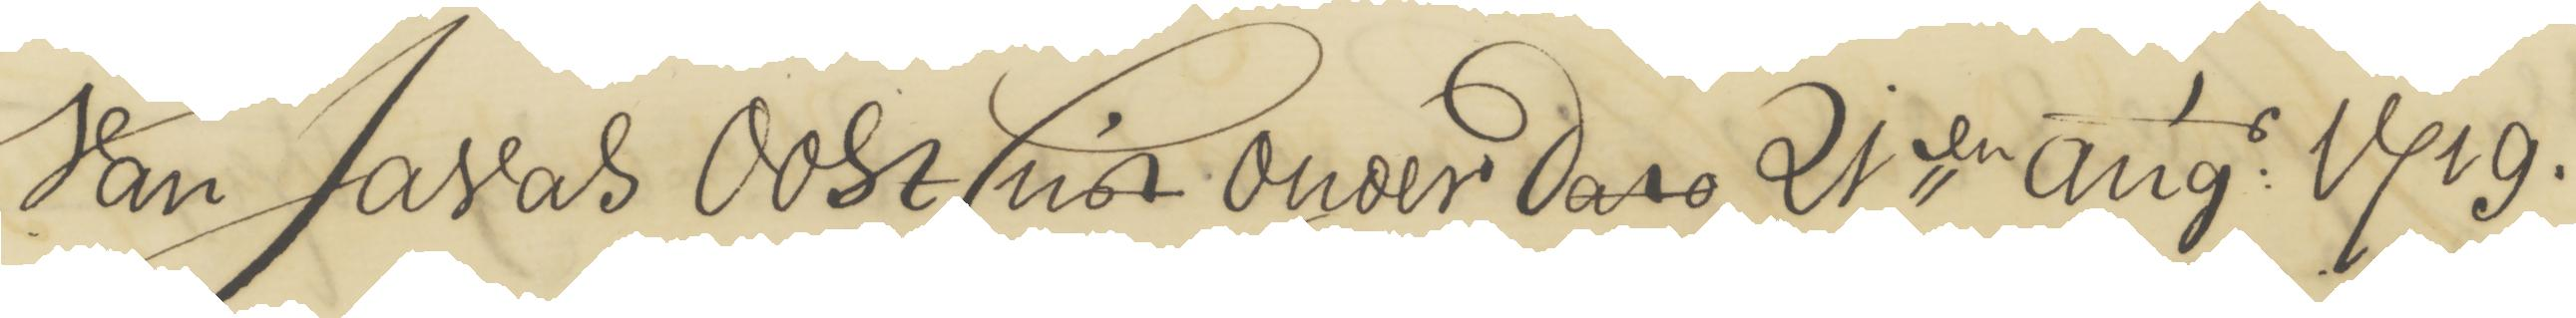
Van Javas Oost Cust onder dato 21„en aug:s 1719.
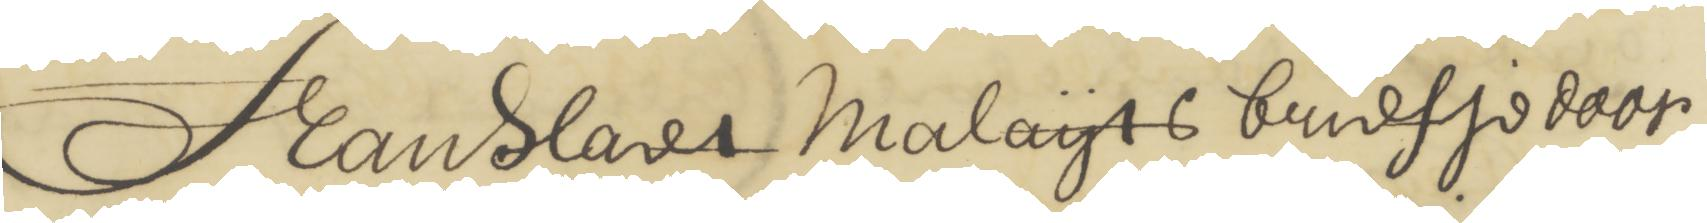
Translaet malaijts briefje door
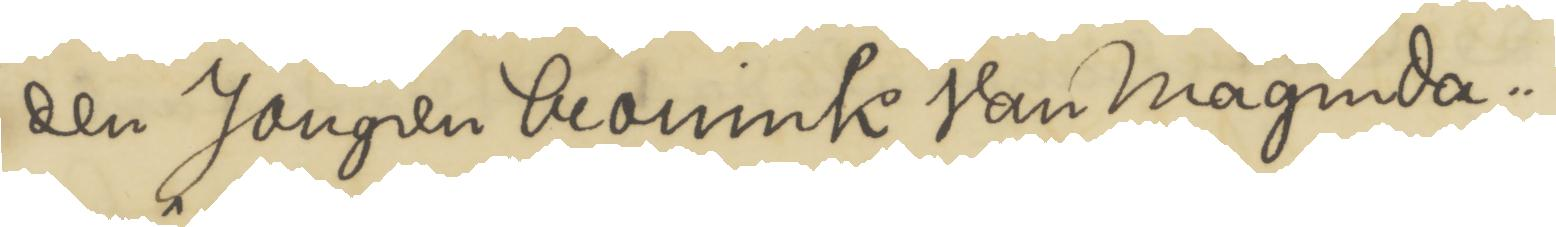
den Jongen konink van maginda„
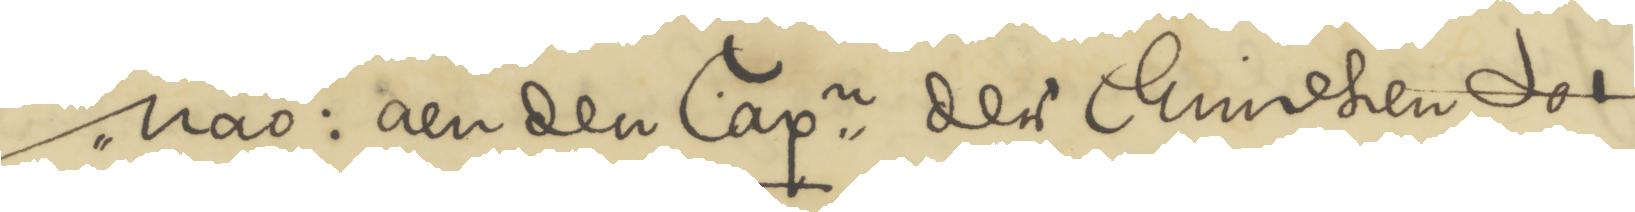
„naô: aen den Cap„n der chinesen tot
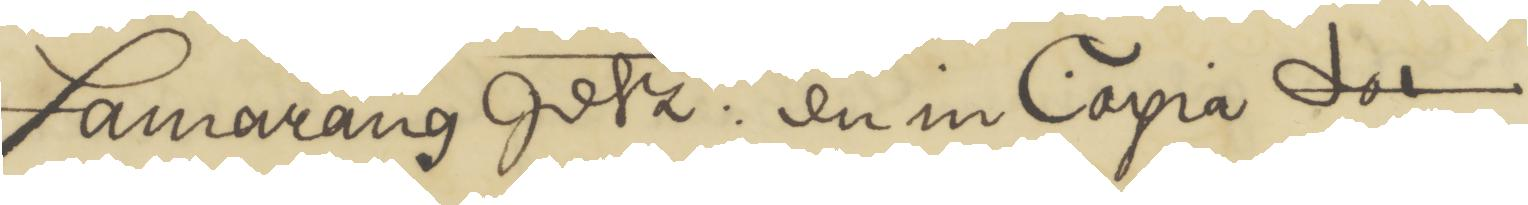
Samarang gesz: en in Copia tot
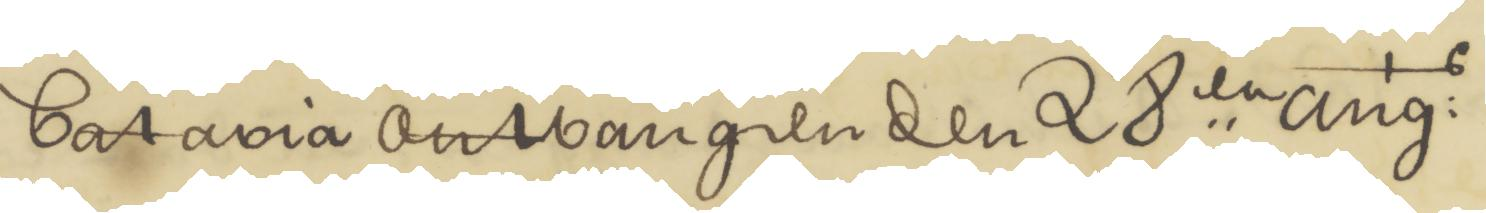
batavia ontvangen den 28„en aug:s
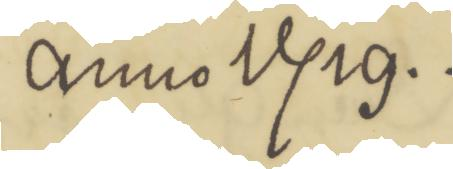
anno 1719.
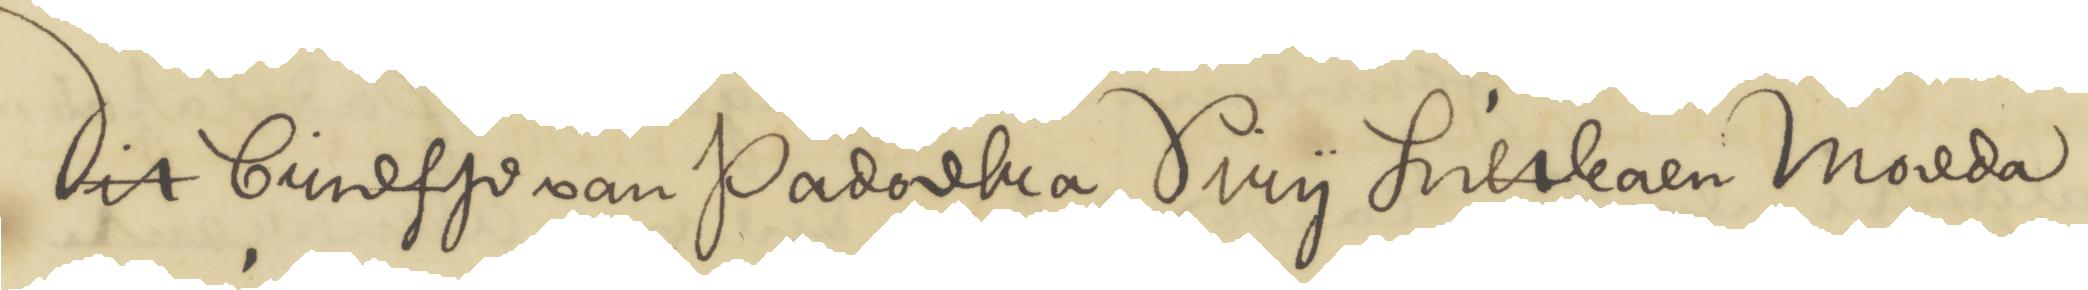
dit briefje van Padoeka Sirij Sulthaen Moeda
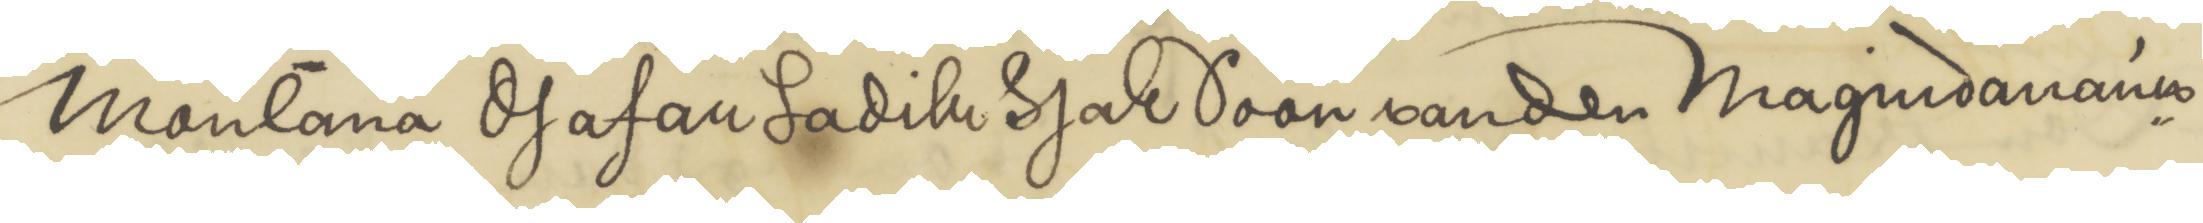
Moulana djafan sadik sjah soon van den Magindanauw„
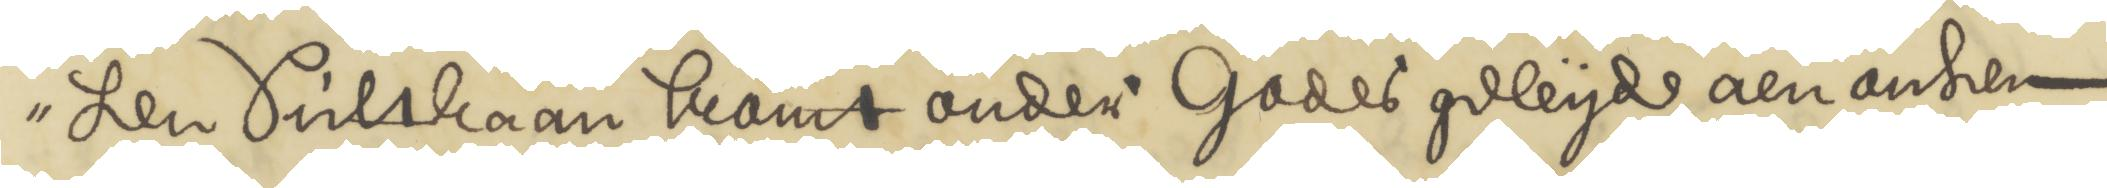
„sen Sulthaan komt onder Godes geleijde aen onsen
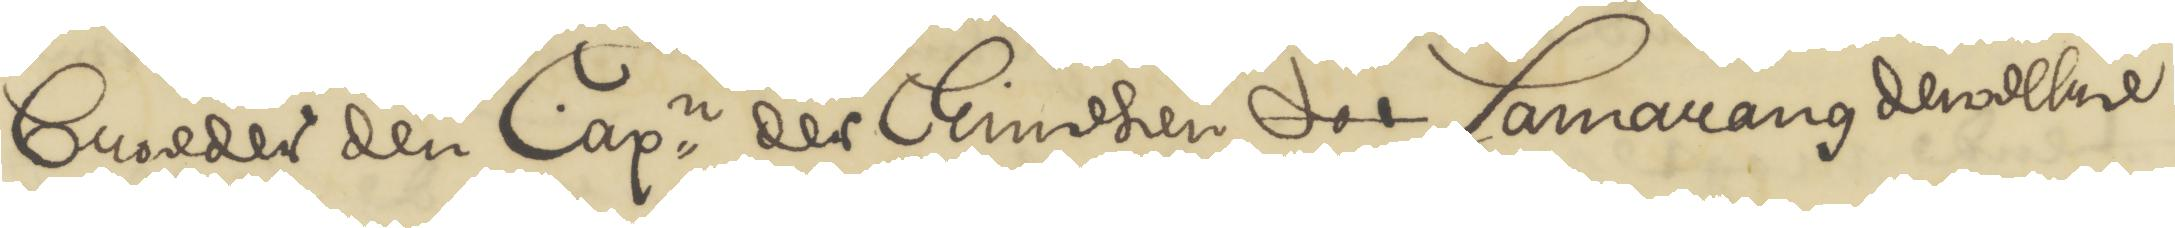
broeder den Cap„n des chinesen tot samarang dewelke
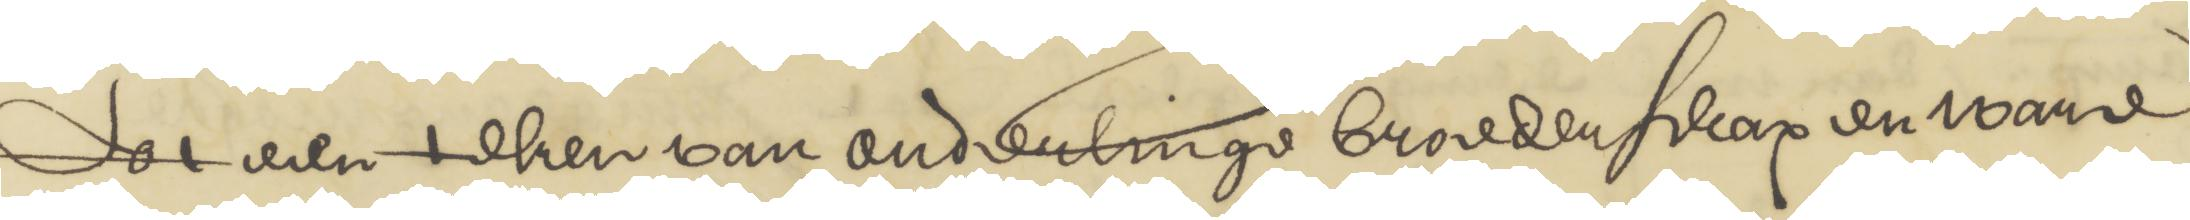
Tot een teken van onderlinge broederschap en ware
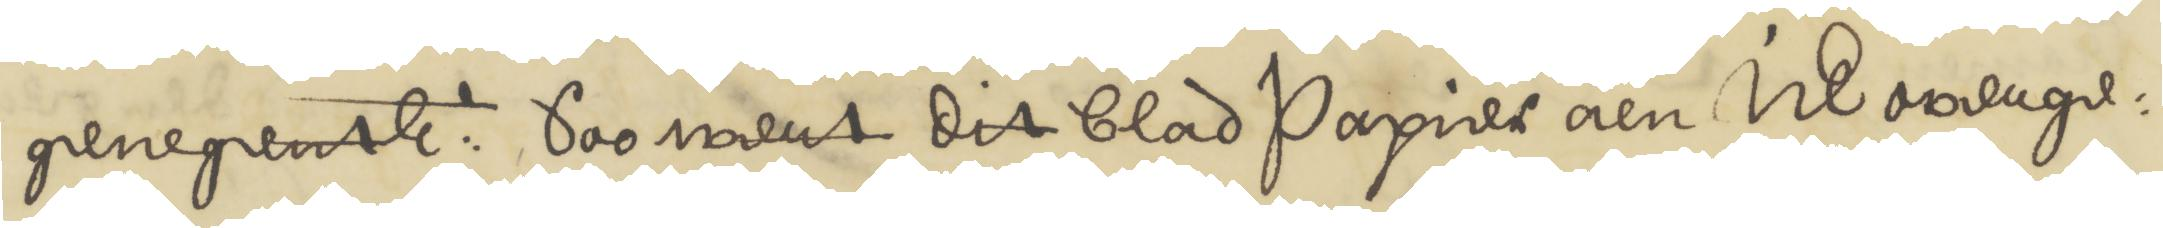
genegenth: soo wert dit blad Papier aen UE overge:
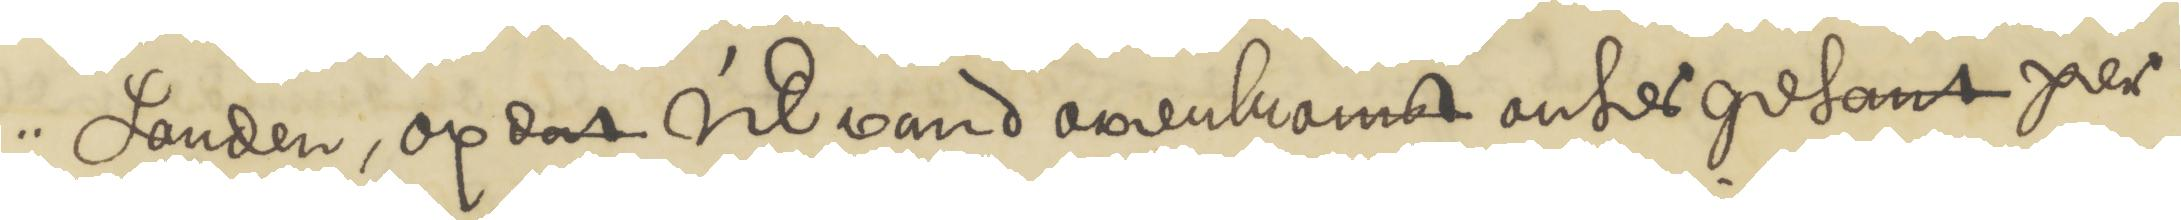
„sonden, op dat UE van d' overkomst onses gesant per
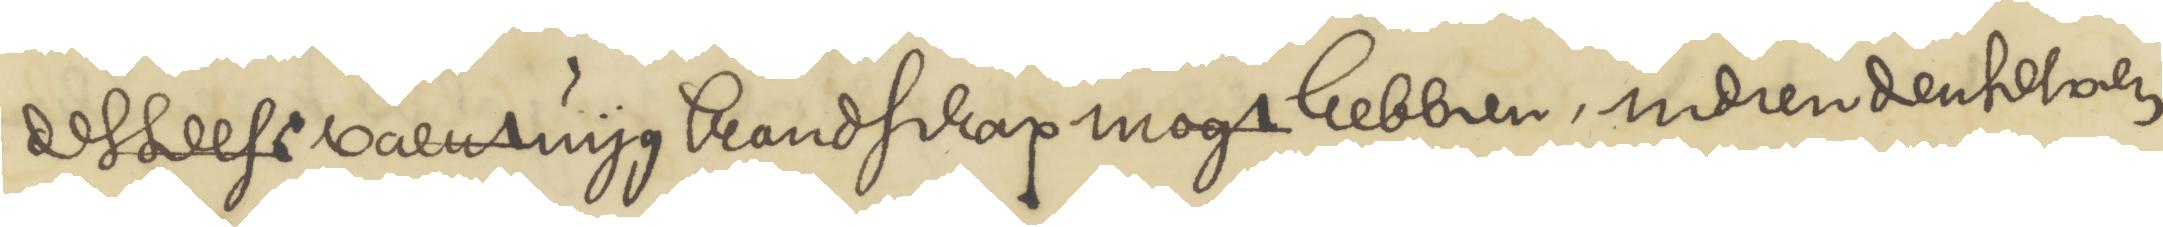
desselfs vaentuijg kondschap mogt hebben, indien denselven
